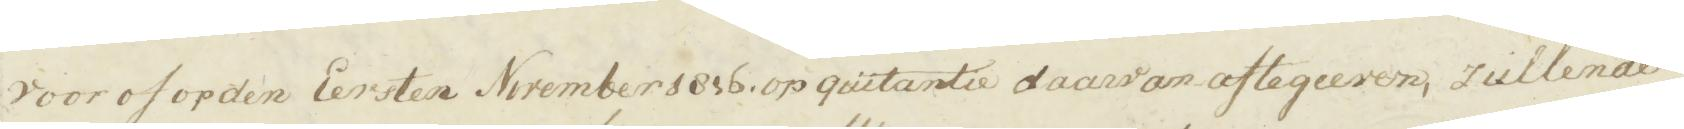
Voor of op den Eersten November 1816, op quitantie daarvan aftegeeven, zullende
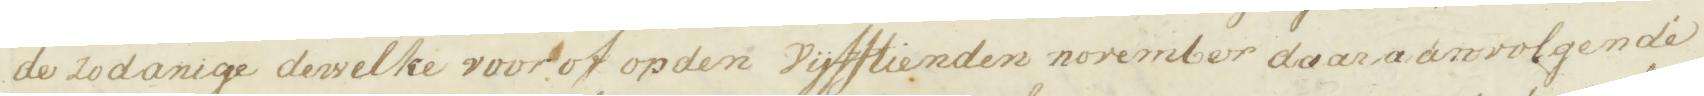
de zodanige dewelke voor of op den vijfftienden november daar aanvolgende
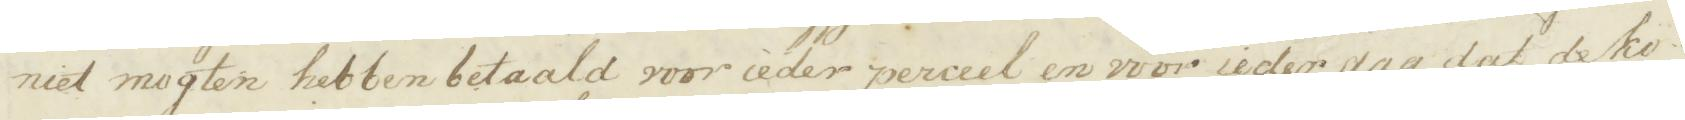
niet mogten hebben betaald voor ieder perceel en voor ieder dag dat de ko„
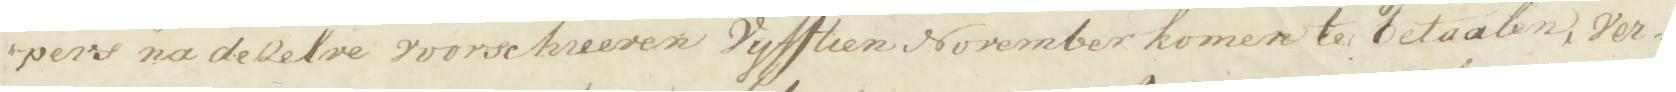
„pers na dezelve voorschreeven vyfftien November komen te betaalen, ver„
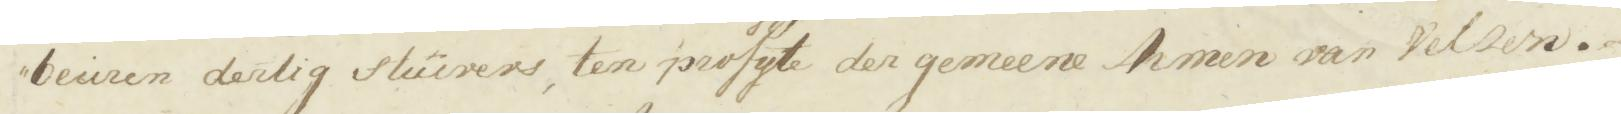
„beuren dertig stuivers, ten profyte der gemeene Armen van Velzen.
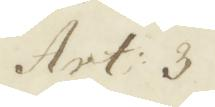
Art: 3
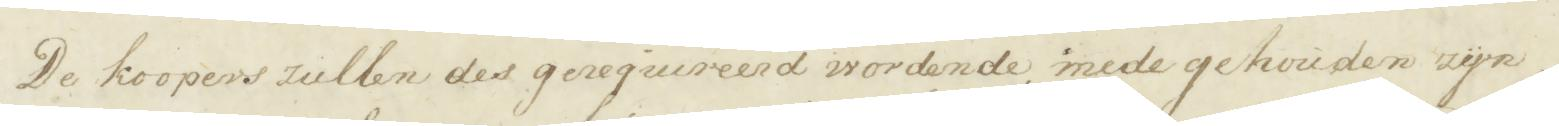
De koopers zullen des gerequireerd wordende, mede gehouden zijn
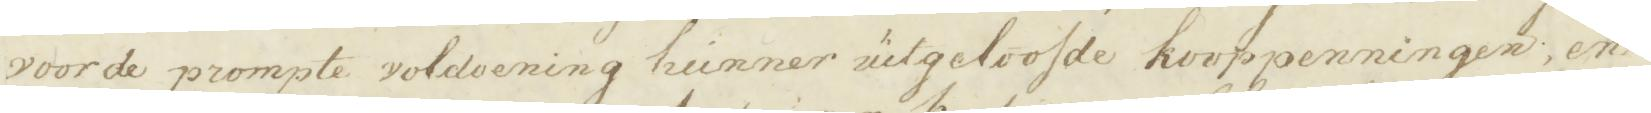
voor de prompte voldoening hunner uitgeloofde kooppenningen; en
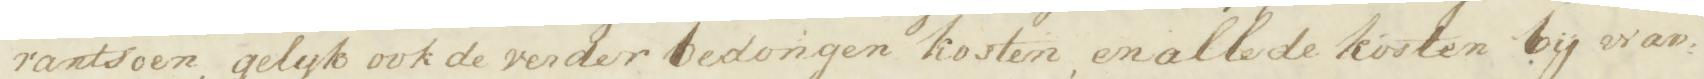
rantsoen, gelyk ook de verder bedongen kosten en alle de kosten bij wan:
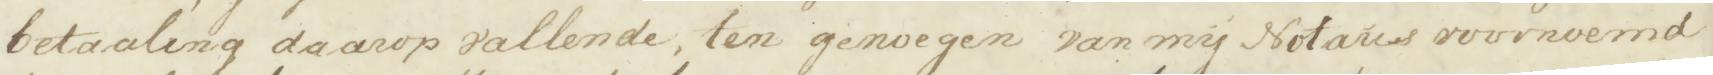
betaaling daarop vallende, ten genoegen van mij Notaris voornoemd
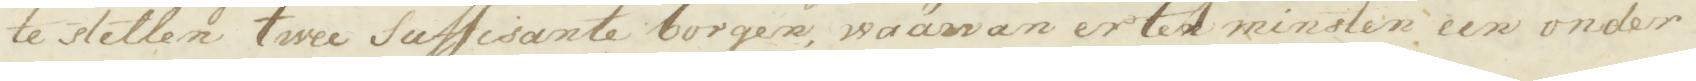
te stellen twee suffisante borgen, waavan er ten minsten een onder
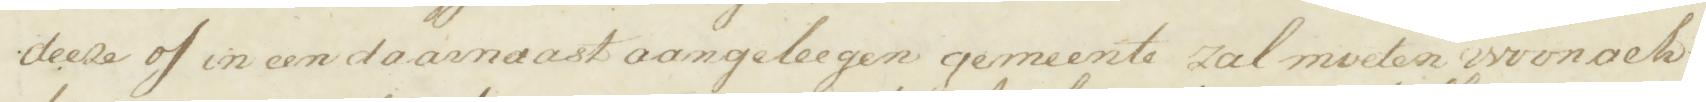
deeze of in een daarnaast aangeleegen gemeente zal moeten woonach:
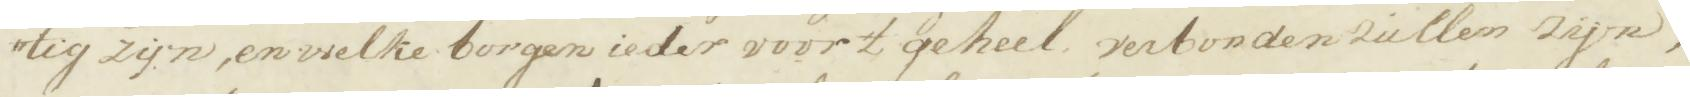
„tig zijn, en welke borgen ieder voor ’t geheel, verbonden zullen zijn,
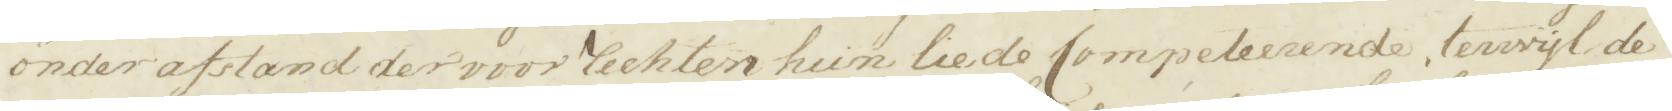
onder afstand der voor Rechten hun liede Competeerende, terwijl de
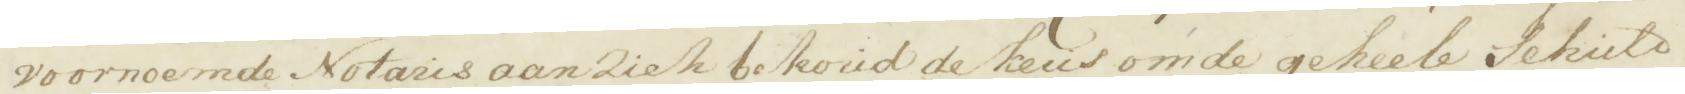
voornoemde Notaris aan zich behoud de keus om de geheele schuld
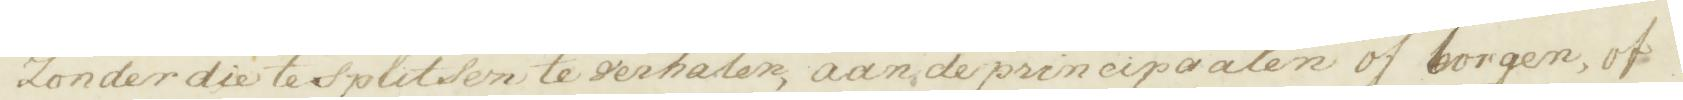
zonder die te splitsen te verhalen, aan de principaalen of borgen, of
